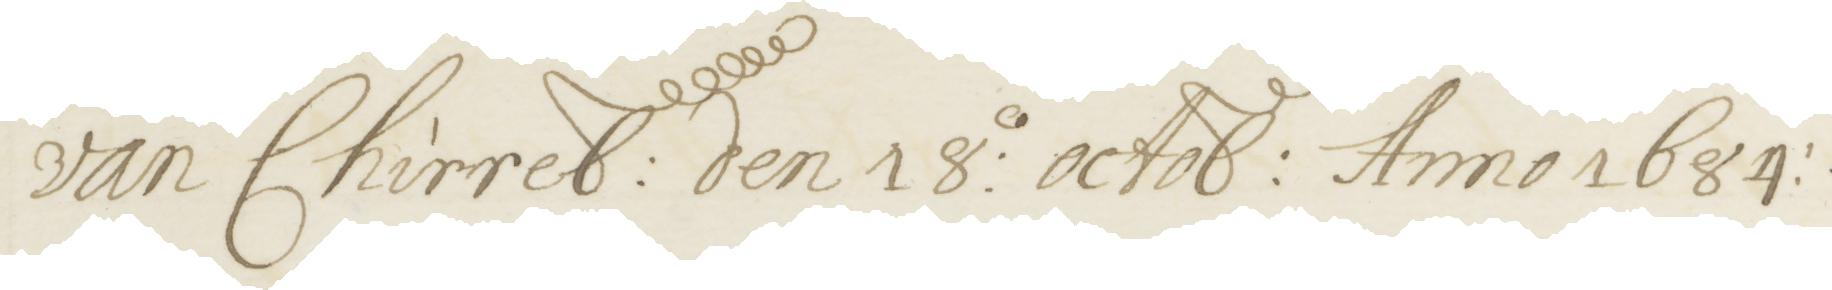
van Chirreb: den 18:e octob: Anno 1684:
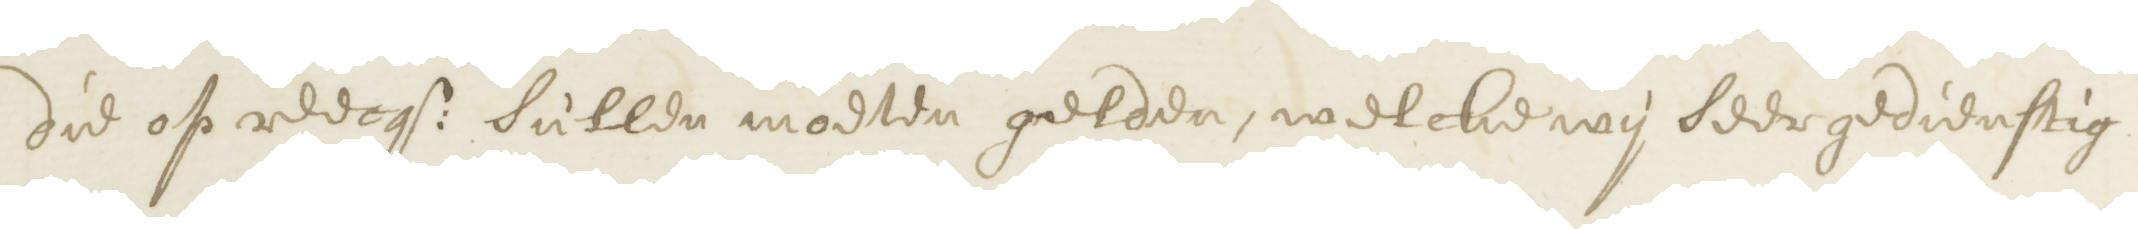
die op reecq: sullen moeten gelden, welcke wij seer gedienstig
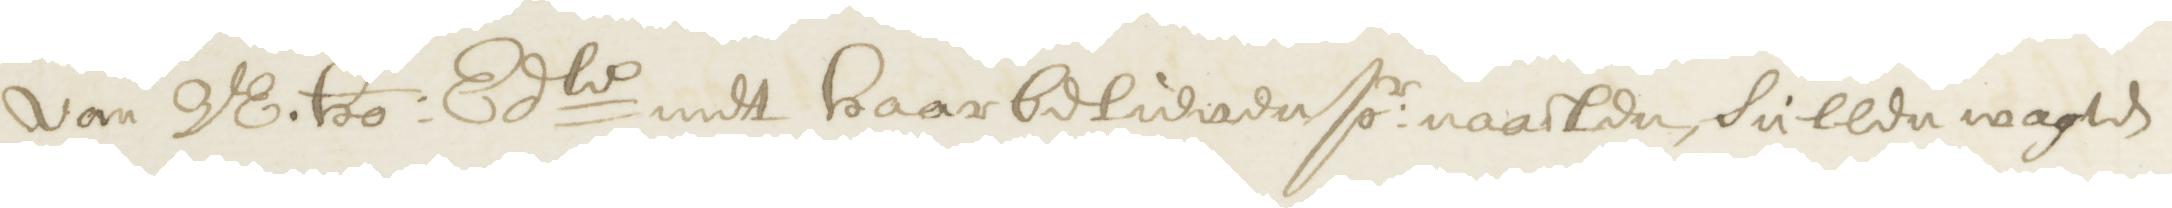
van VE. Ho: Ed=le met haar believen p:r naasten, sullen wagten
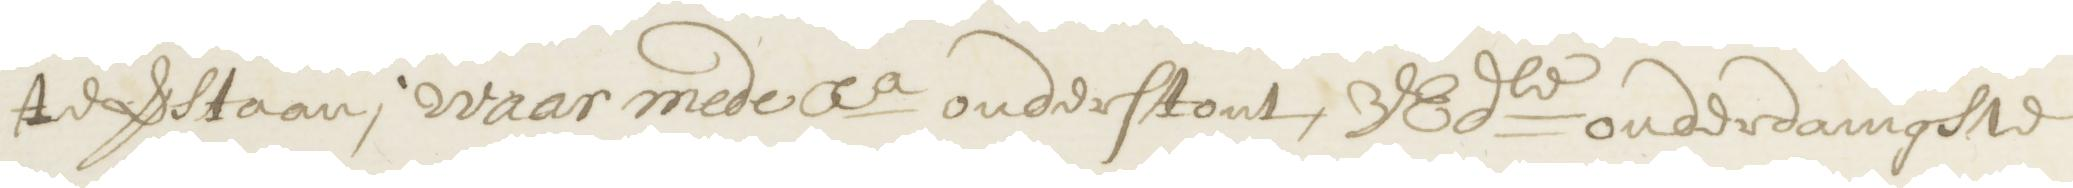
teverstaan; waar mede &=a onderstont, VEd=le onderdanigste
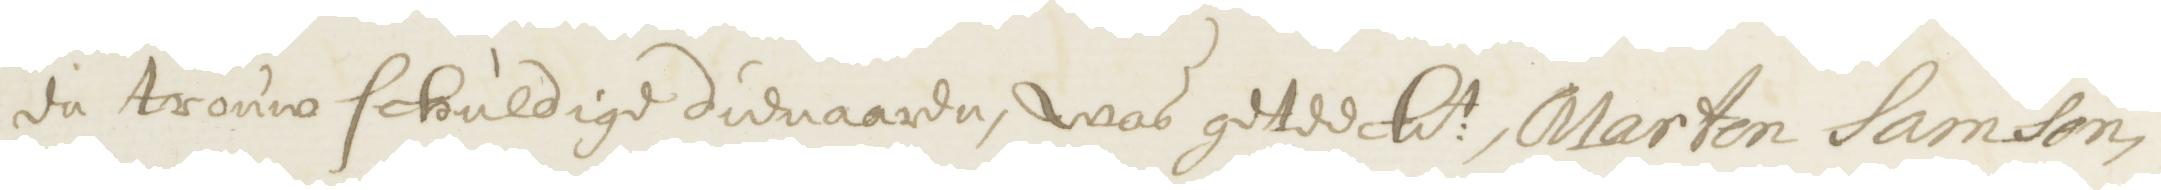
en trouw schuldige dienaaren, was geteeck:t, Marten Samson,
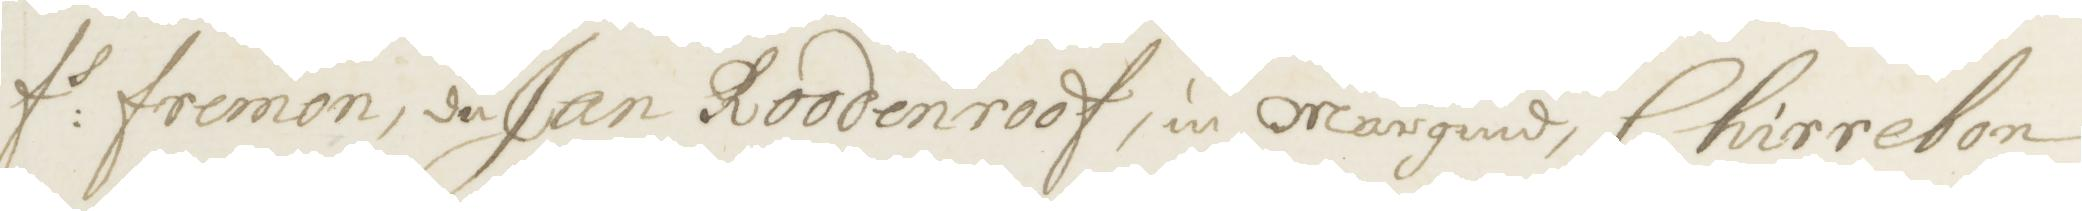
f:s fremon, en Jan Roodenroof, in Margine, Chirrebon
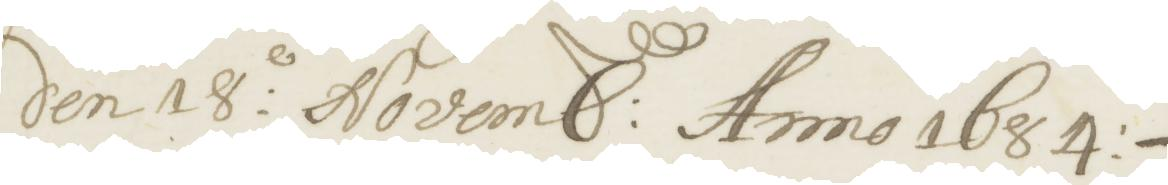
den 18:e Novemb: Anno 1684:—
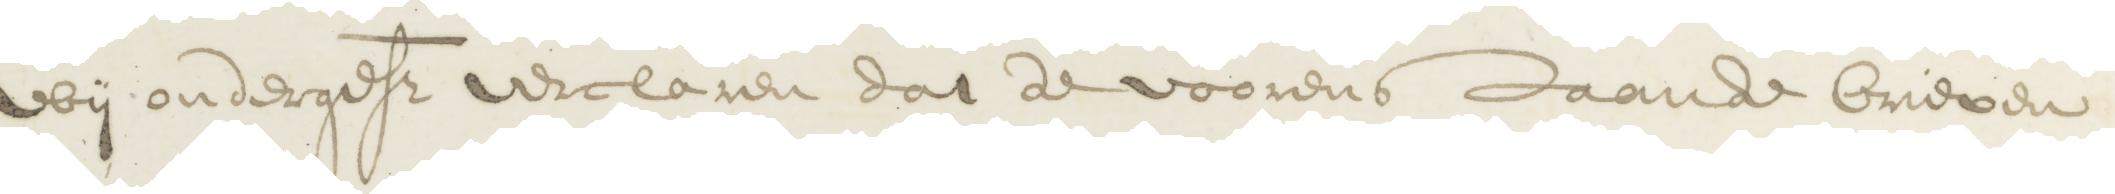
wij ondergesz verclaren dat de voorenstaande brieven
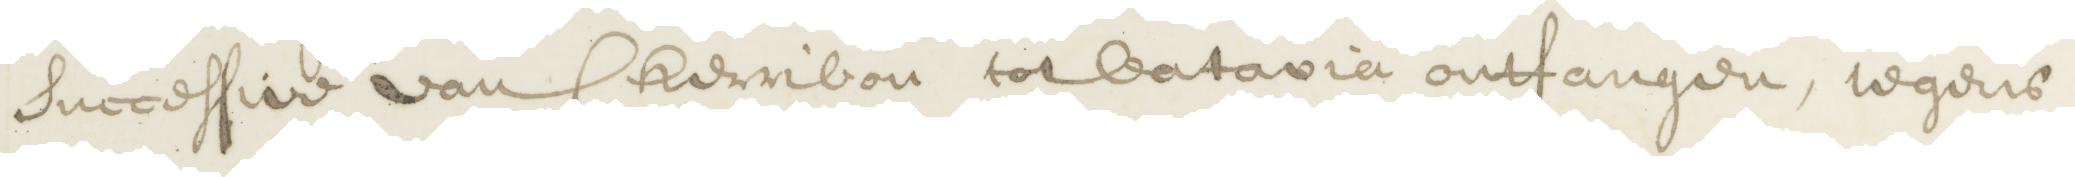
successive van Cherribon tot batavia ontfangen, tegens
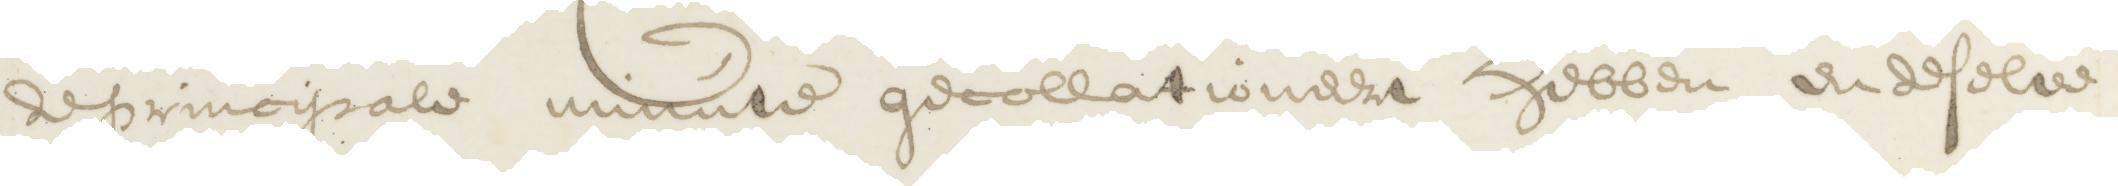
de principale minute gecollationeert hebben en deselve
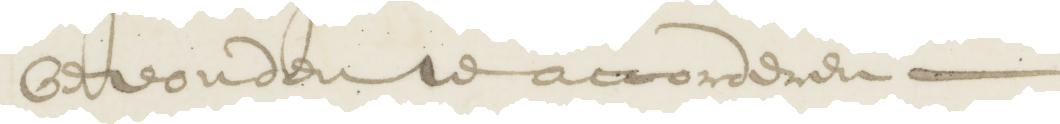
bevonden te accorderen —
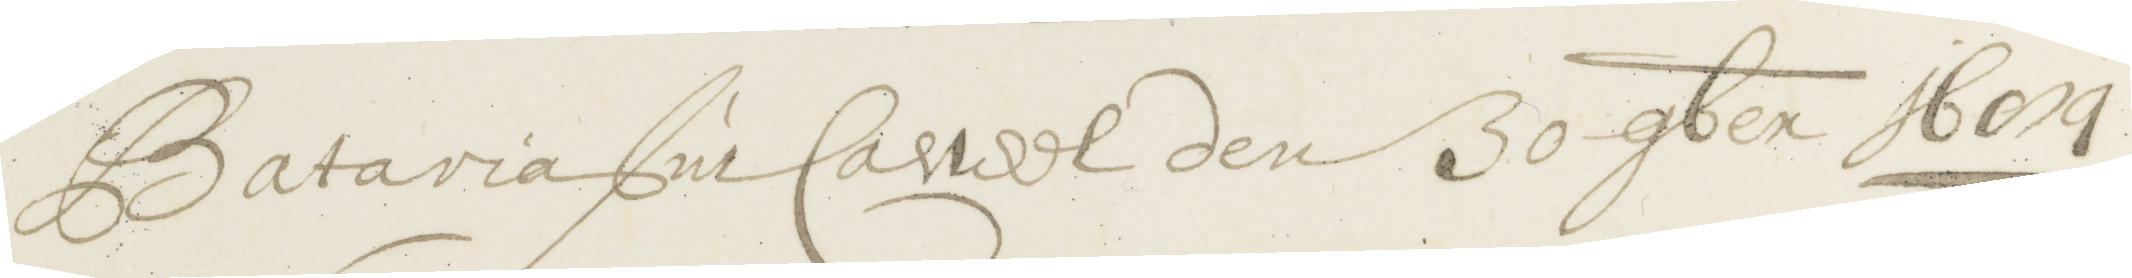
Batavia Jn't Casteel den 30 gber 1684
